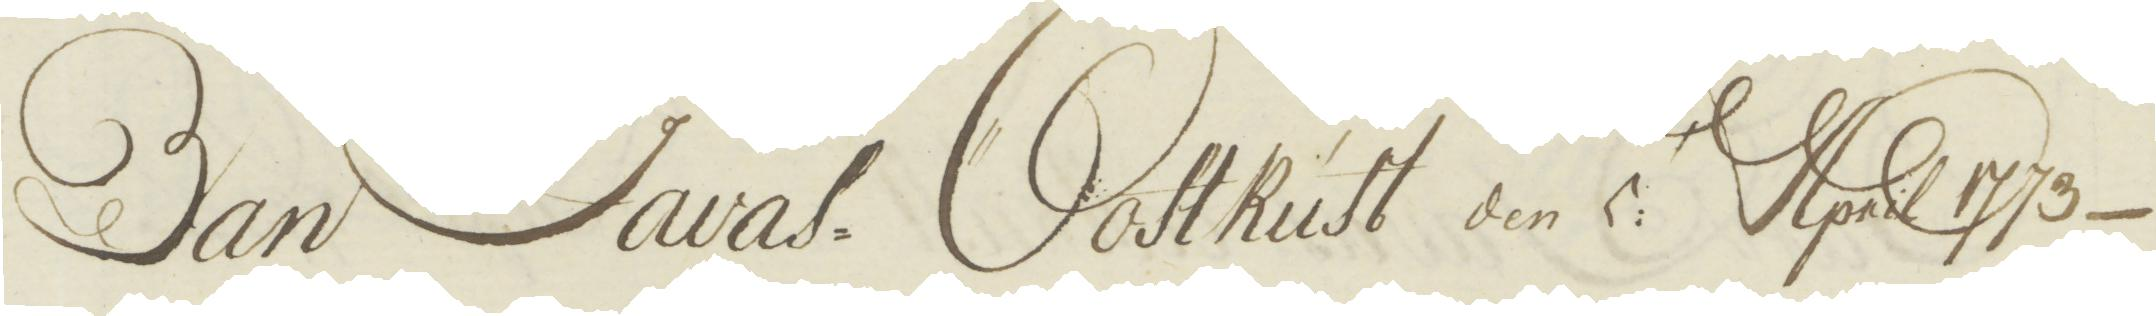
Van Iavas= Oost Kust den 5:' April: 1773—
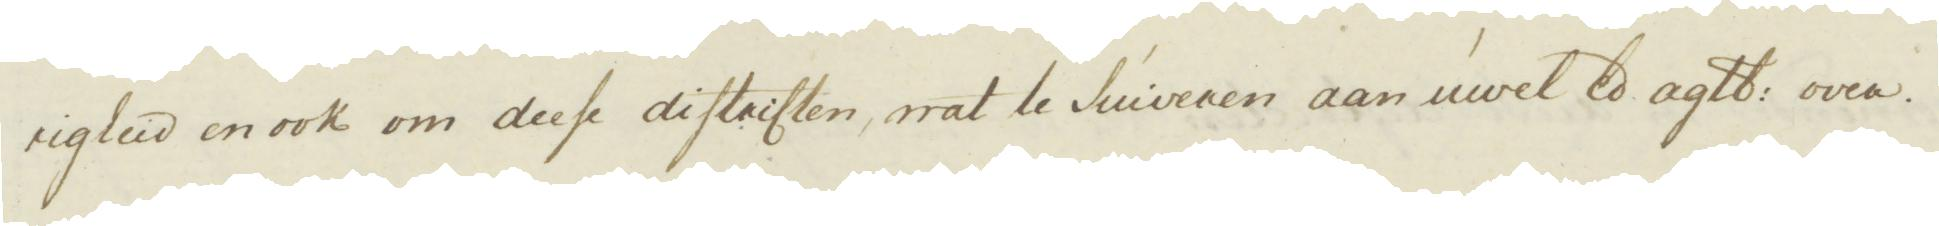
righeid en ook om deese distristen, wat te suiveren aan uwel Ed: agtb: over.
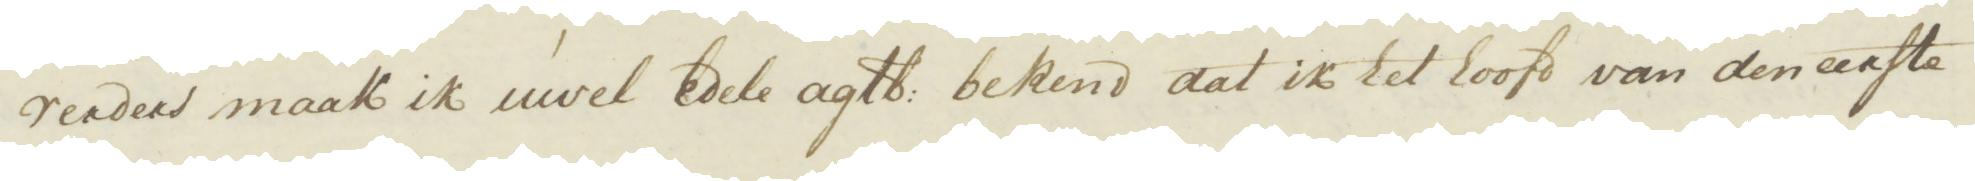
verders maak ik uwel Edele agtb: bekend dat ik het hoofd van den eerste
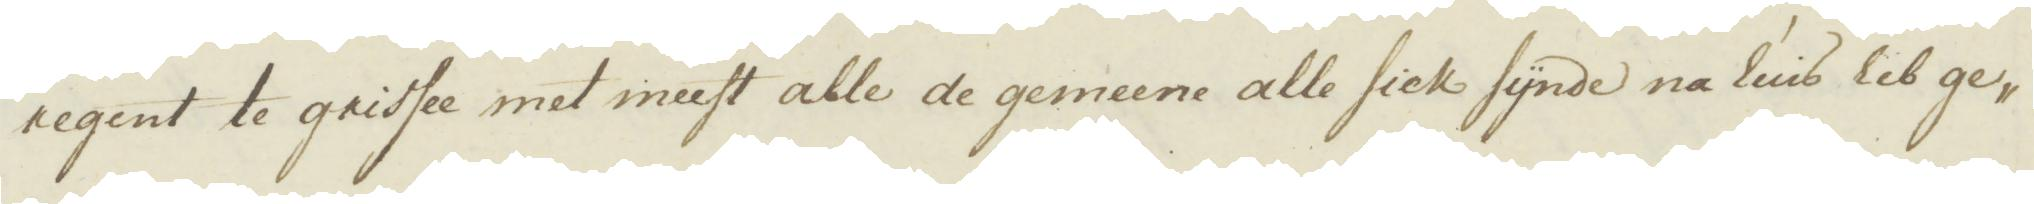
regent te grissee met meest alle de gemeene alle siek sijnde na huis heb ge„
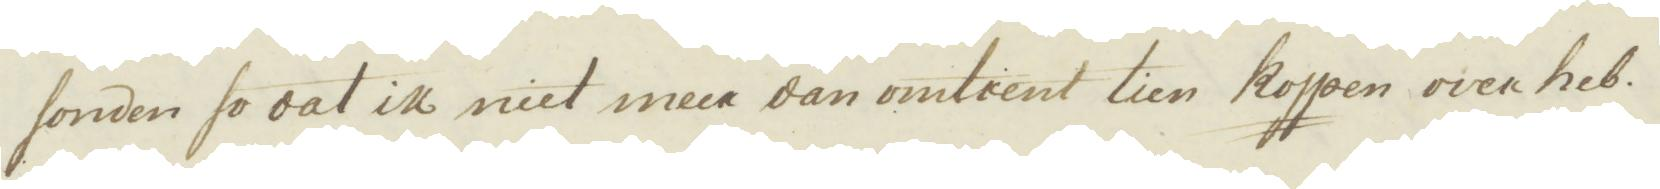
sonden so dat ik niet meer dan omtrent tien koppen over heb.
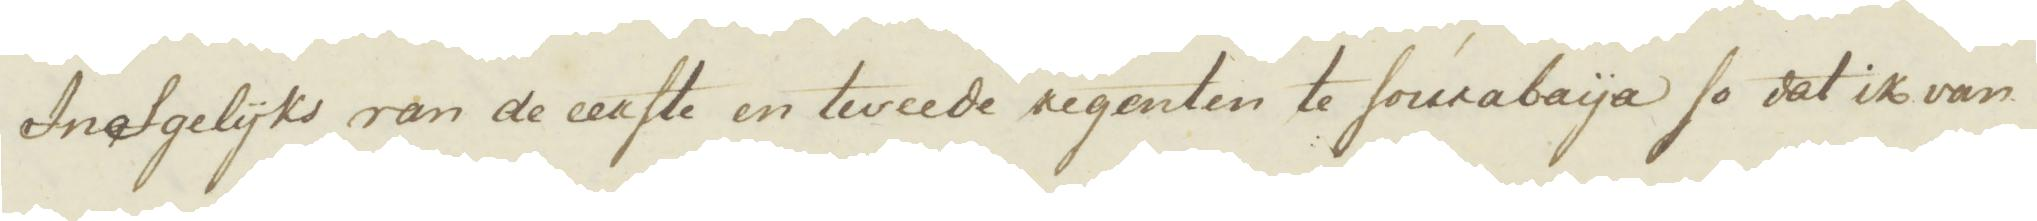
Insgelijks van de eerste en tweede regenten te sourabaija so dat ik van
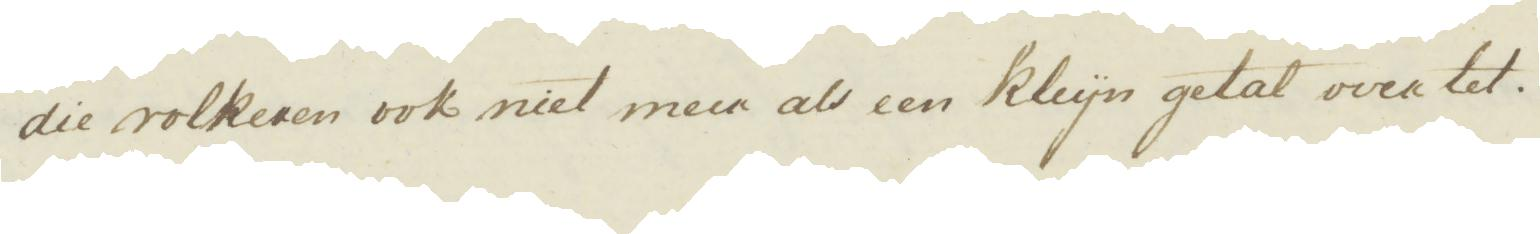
die volkeren ook niet meer als een kleijn getal over het.
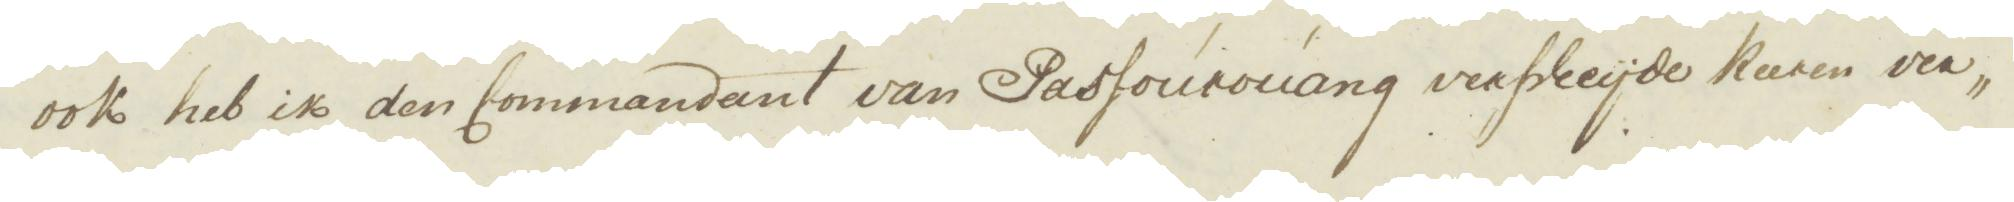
ook heb ik den Commandant van Passourouang verscheijde keeren ver„
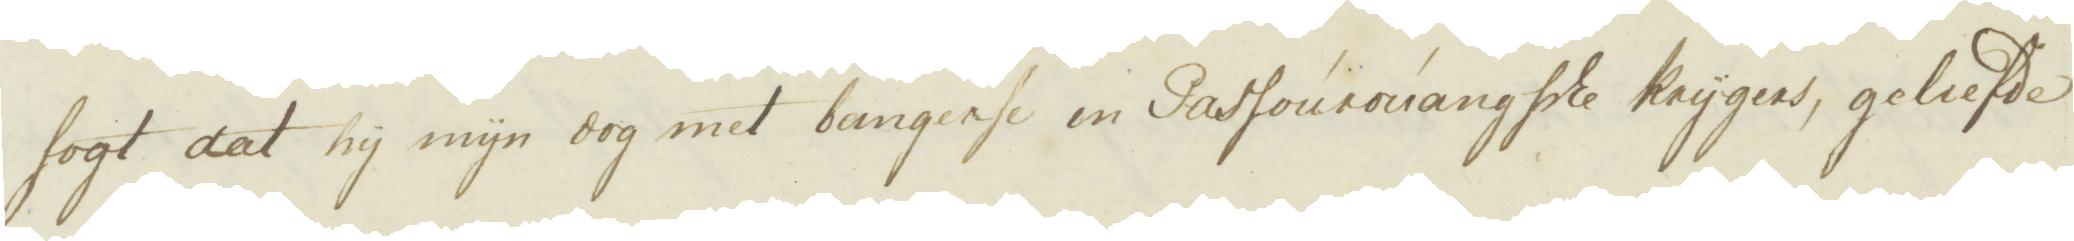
sogt dat hij mijn dog met bangerse en Passourouangsche krijgers, geliefde
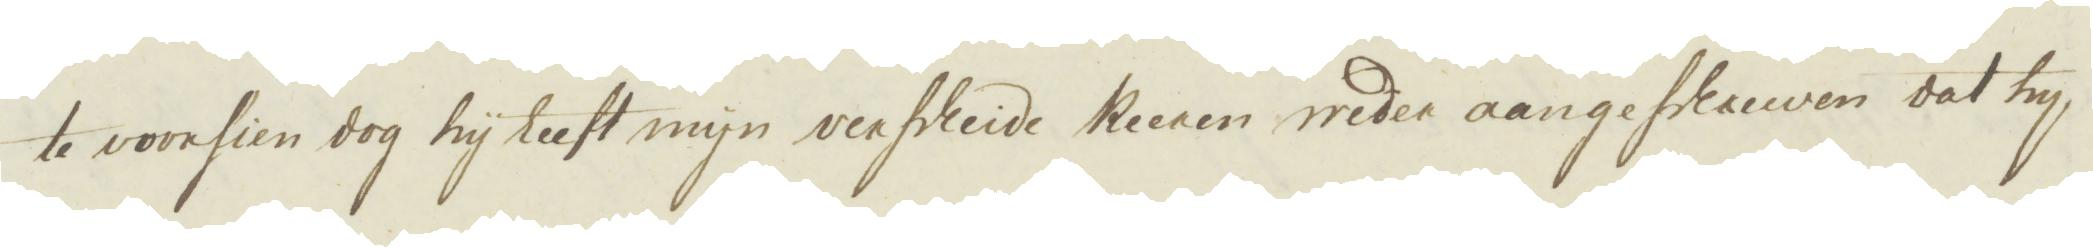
te voorsien dog hij heeft mijn verscheide keeren weder aangeschreeven dat hy
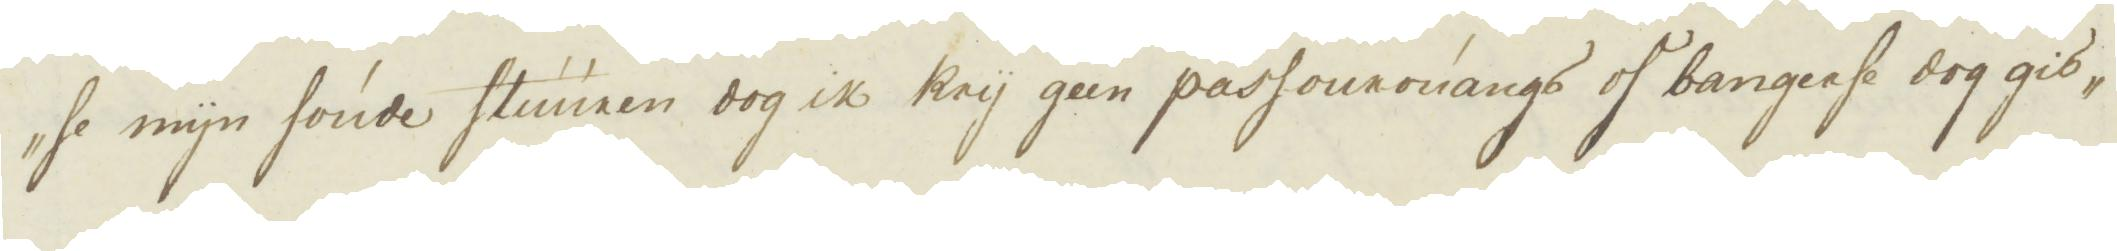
„se mijn soude stuuren dog ik krij geen passourouangs of bangerse dog gis„
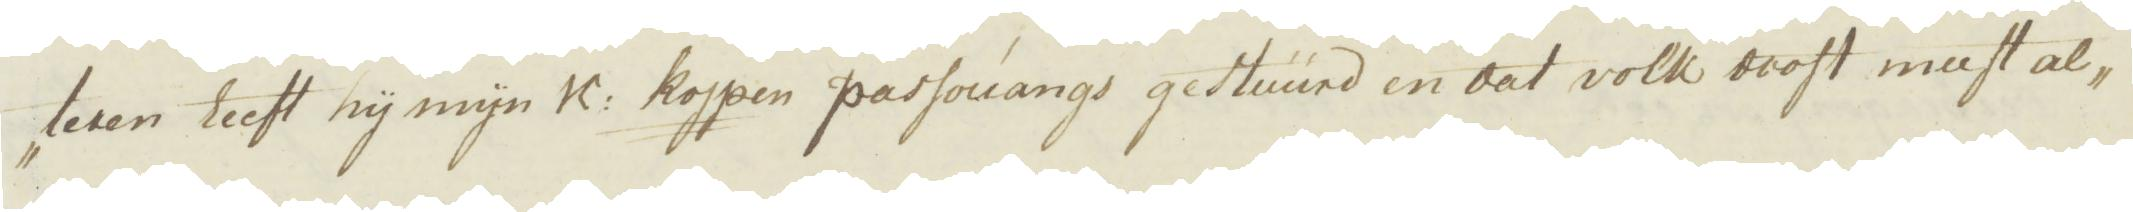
„teren heeft hij mijn 15: koppen passouangs gestuurd en dat volk boost meest al
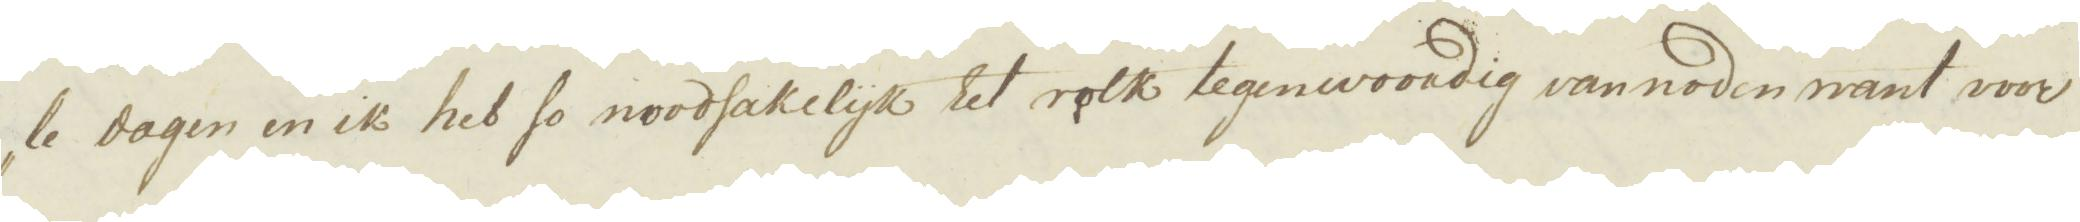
„le dagen en ik heb so noodsakelijk het volk tegenwoordig van noden want voor
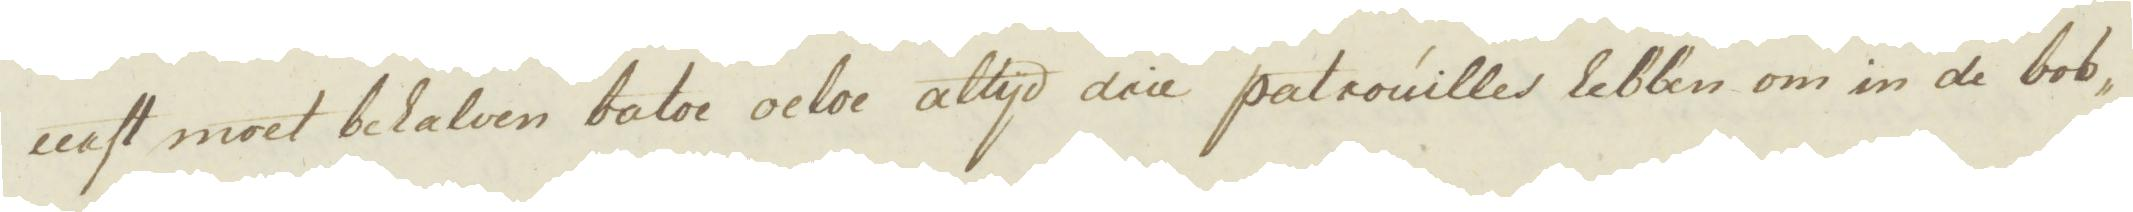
eerst moet behalven batoe oeloe altijd drie patrouilles hebben om in de bos„
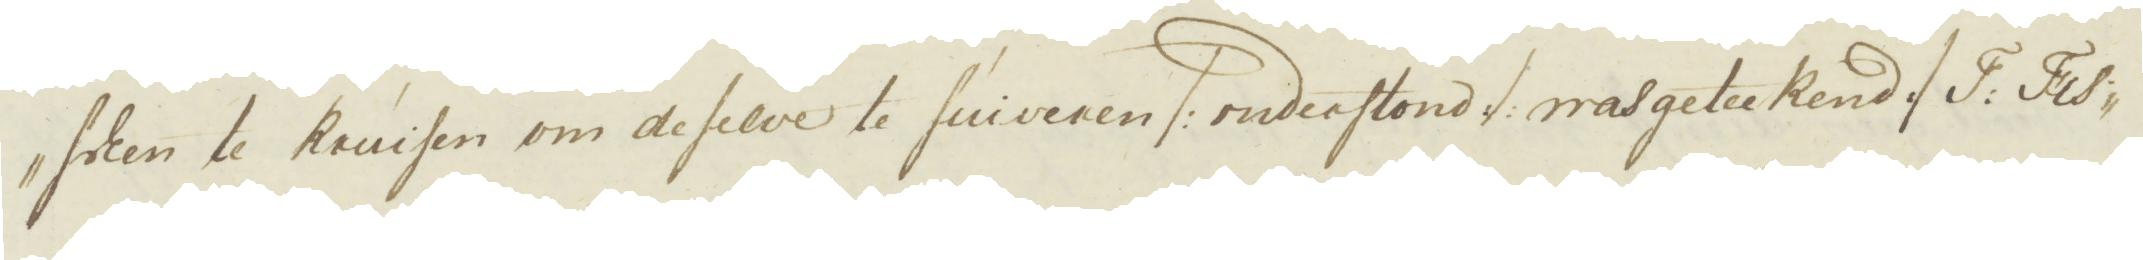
„schen te kruisen om deselve te suiveren /:onderstond :/: was geteekend :/ F: Fis„
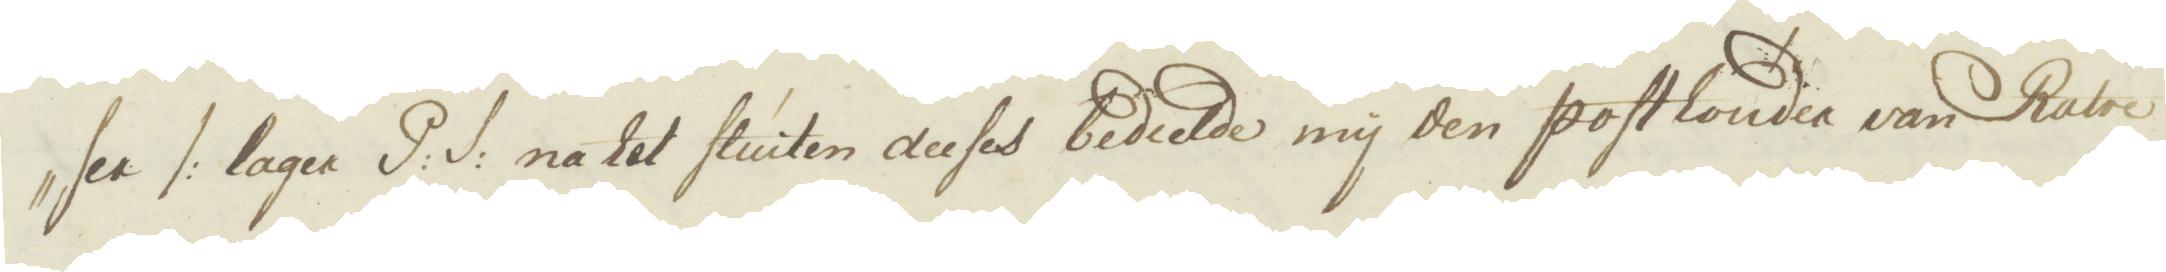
„ser /:lager P: S: na het sluiten deses bedeelde mij den posthouder van Ratoe
